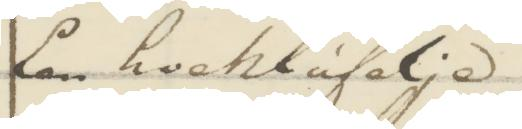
Een hoeklafetje
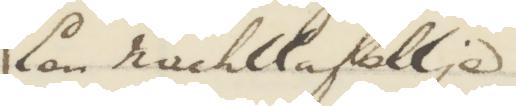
Een wachttafeltje
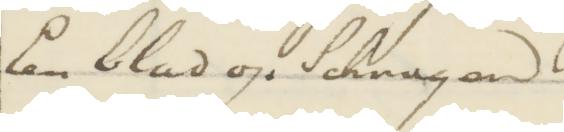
Een blad op schragen
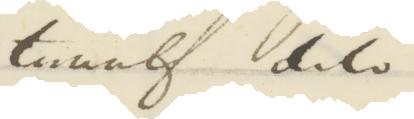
twaalf dito
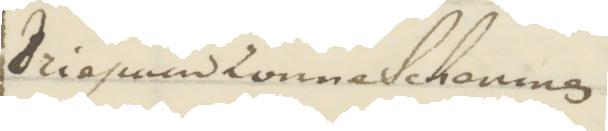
drie paar zonneschermen
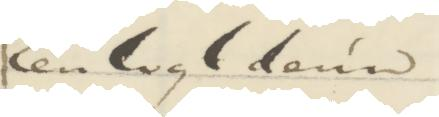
Een togt deur
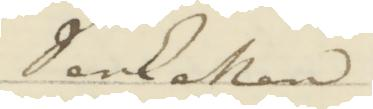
Verlaken
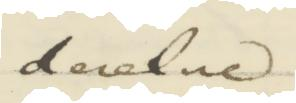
decelve
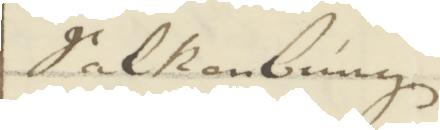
Valkenburg
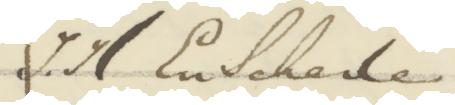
J. H Enschedé
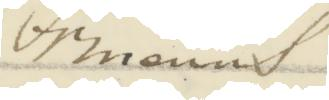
V meurs
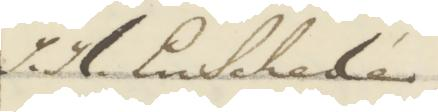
I. H. Enschedé
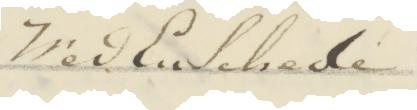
Wed. Enschedé
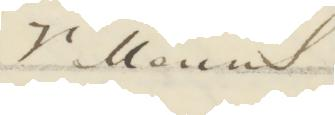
V. Meurs
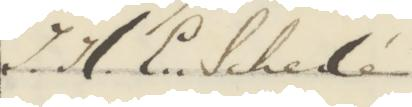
J. H. Enschedé
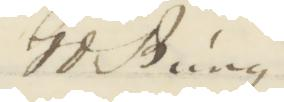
JJ Burg
